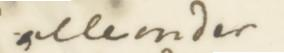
alle onder
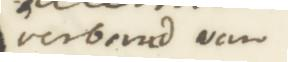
verband van
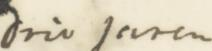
drie jaren
